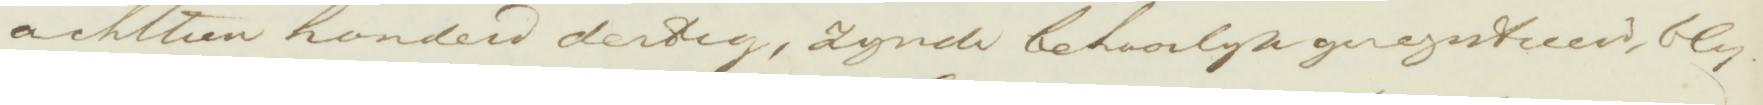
achttien honderd dertig, zynde behoorlyk geregistreerd, bly
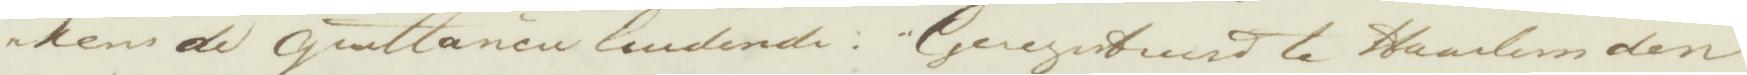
kens de Quittancie luidende: Geregistreerd te Haarlem den
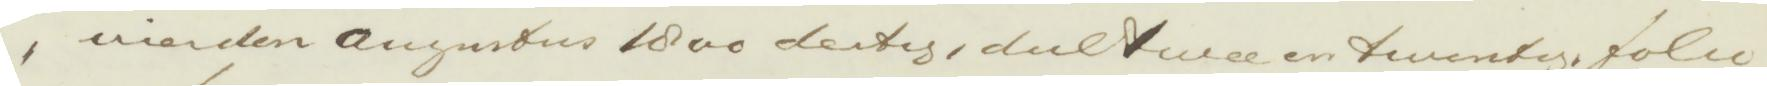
„ vierden augustus 1800 dertig, deel twee en twintig, folio
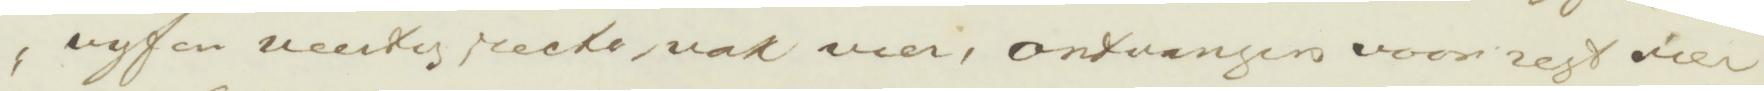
„ vyfen veertig recto vak vier, ontvangen voor regt vier
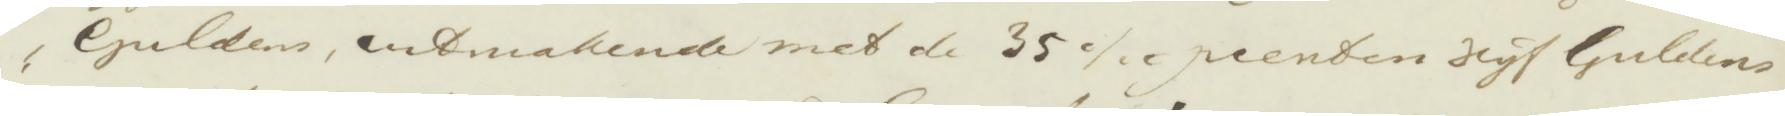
„ Guldens, uitmakende met de 35% opcenten vijf Guldens
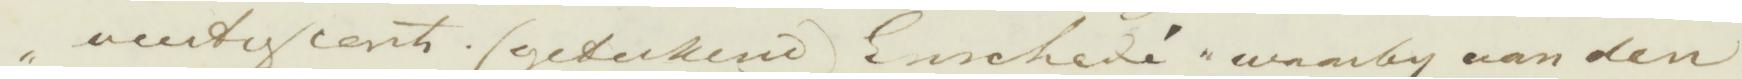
„ veertig Cents. (geteekend) Enschedé „waarby aan den
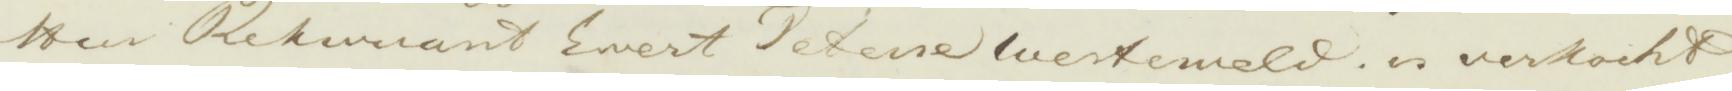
Heer Rekwirant Evert Peterse westerveld, is verkocht
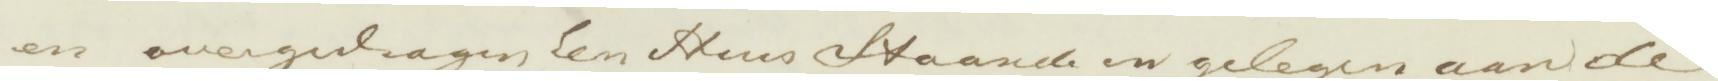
en overgedragen Een Huis Staande in gelegen aan de
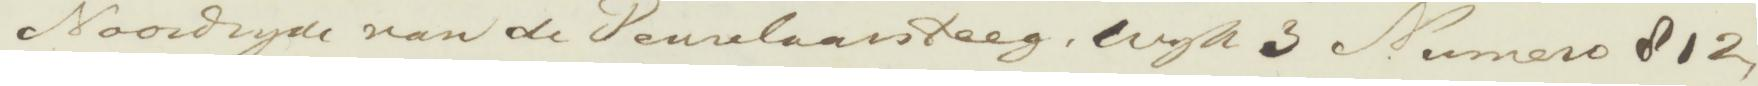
Noordzyde van de Peuzelaarsteeg, wyk 3 Numero 812
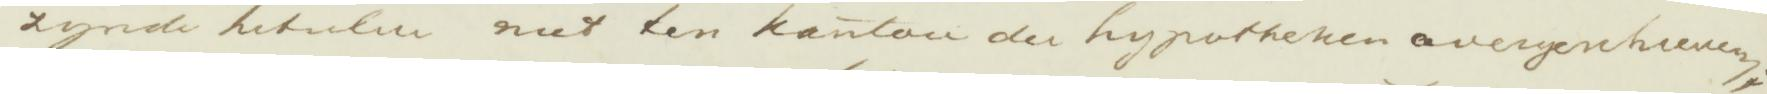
zynde hetzelve niet ten kantore der hypotheken overgeschreven
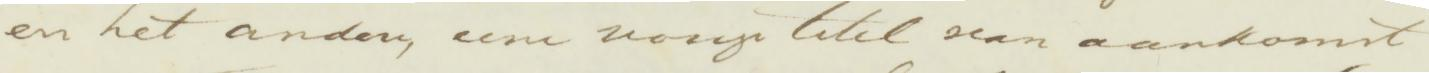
en het andere, eene vorige titel van aankomst
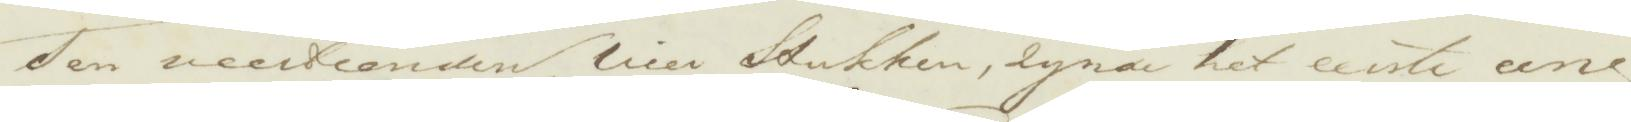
Ten veertienden, vier stukken, zynde het eerste, eenen
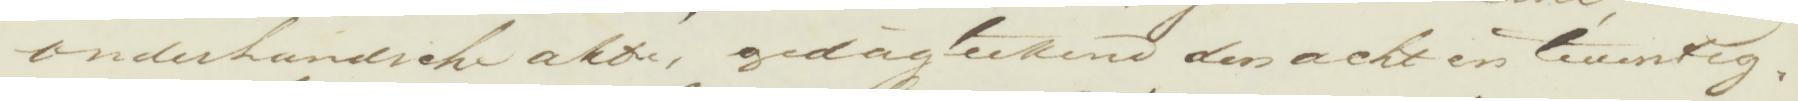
onderhandsche akte, gedagteekend den acht en twintig„
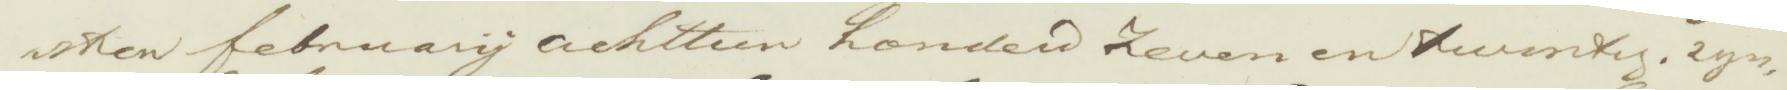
sten februarij achttien honderd zeven en twintig, zyn,
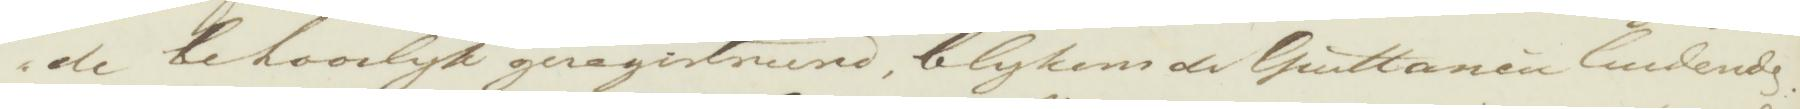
„de behoorlyk geregistreerd, blykens de Quittancie luidenden
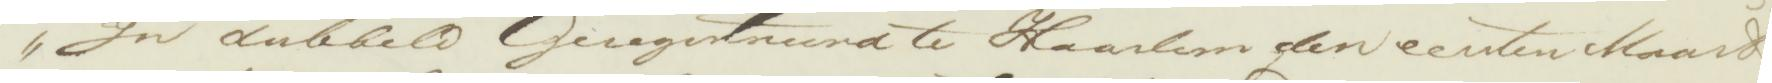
„ In dubbeld Geregistreerd te Haarlem, den eersten Maart
